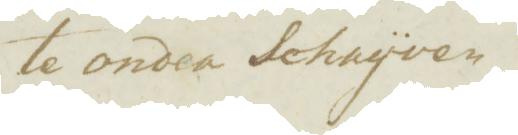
te onder schrijven
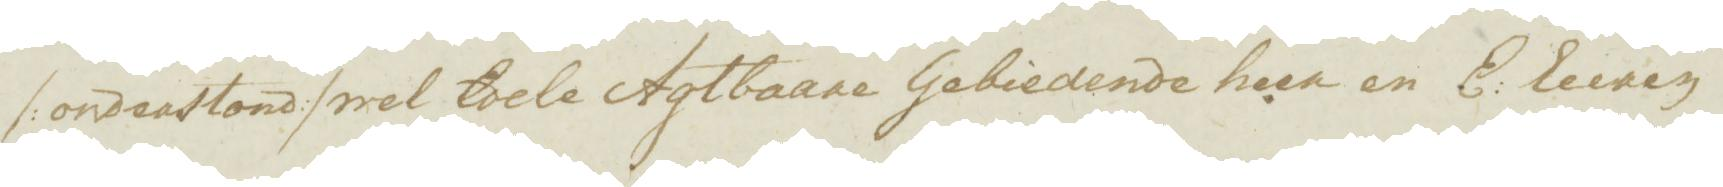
/:onderstond:/ wel Edele Agtbaare Gebiedende heer en E: heeren
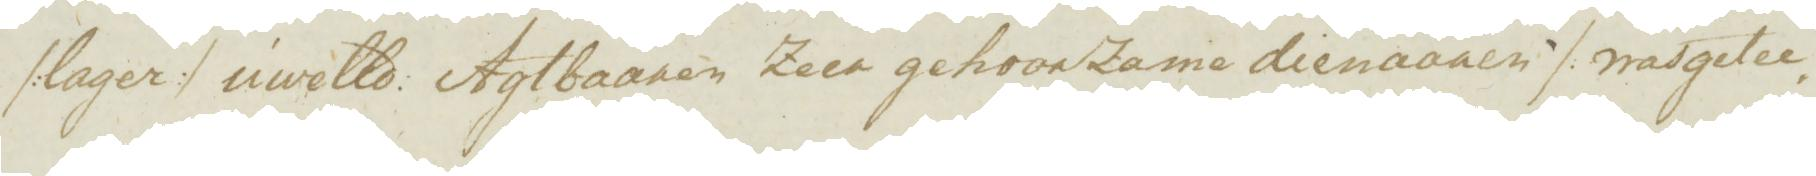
/:lager:/ uwelEd: Agtbaaren zeer gehoorzame dienaaren /: was getee„
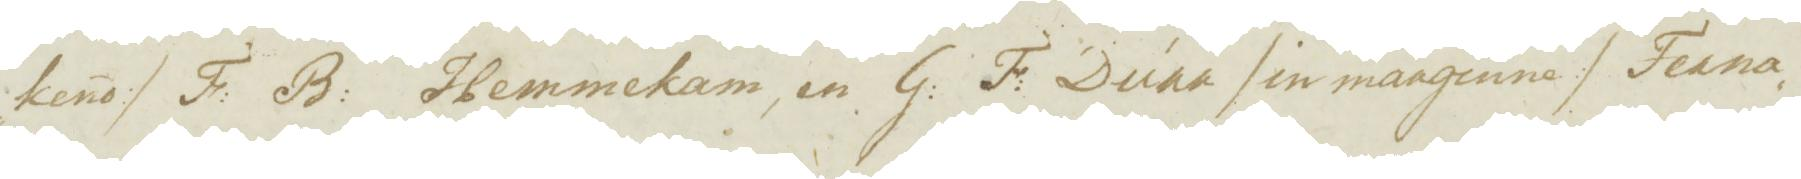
„kend:/ F: B: Hemmekam, en G: F: Durr /in marginne:/ Terna„
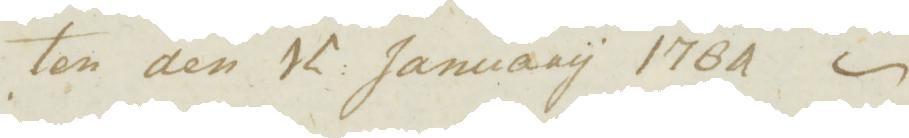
ten den 15: Januarij 1784 ~
